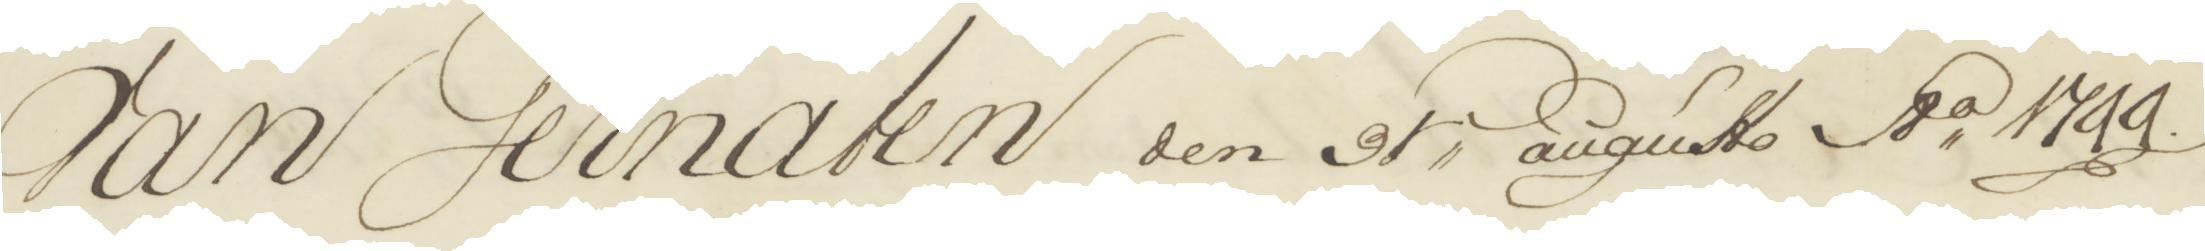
Van Ternaten den 31„' augusto A„o 1744.
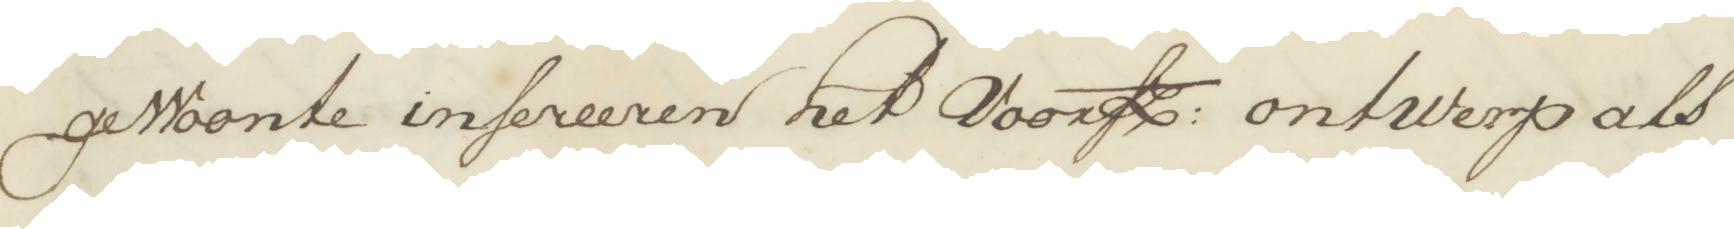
gewoonte insereeren het voorsz: ontwerp als
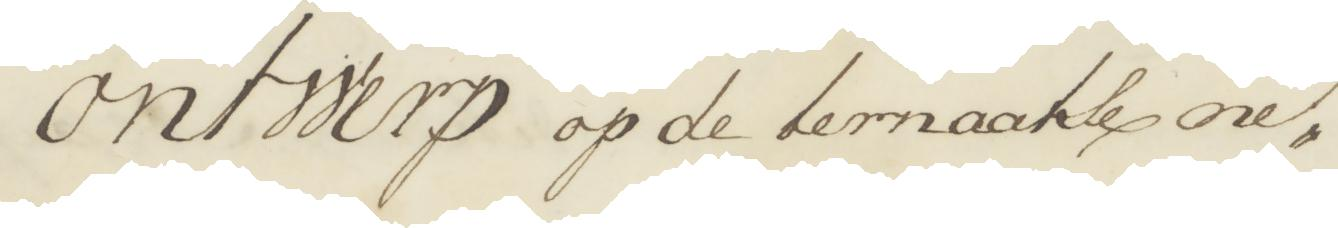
ontwerp op de ternaakse ne„
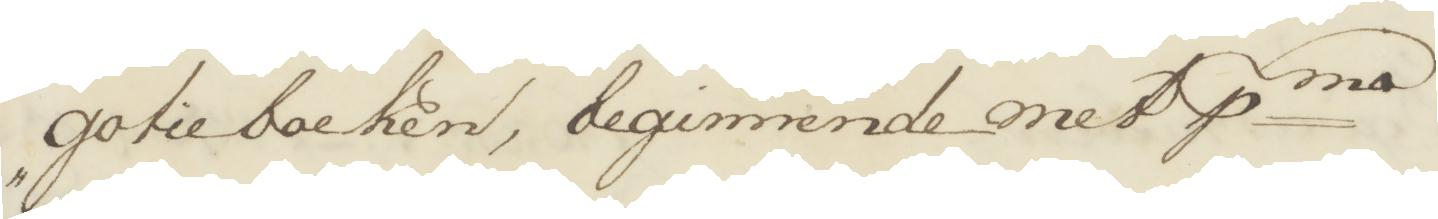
„gotieboeken, beginnende met p=ma
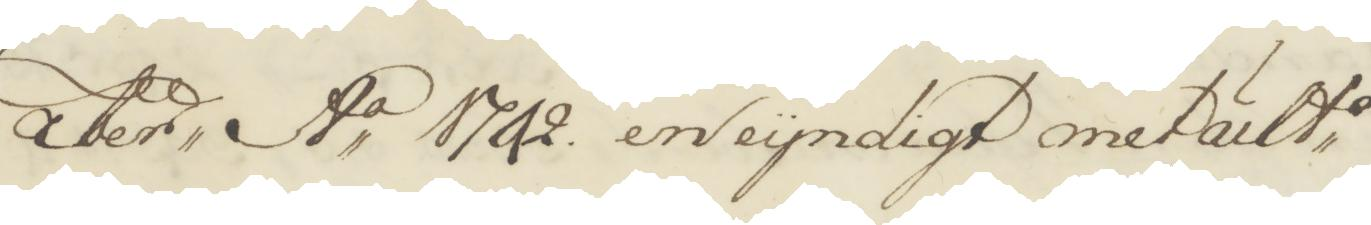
xber, A„o 1742. en eijndigt met ult„o
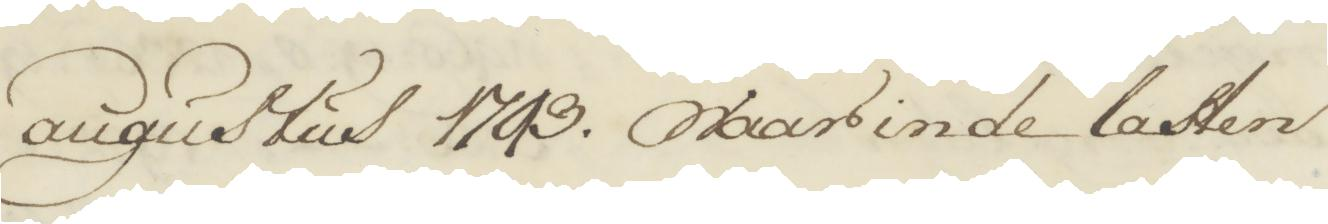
augustus 1743. waar in de lasten
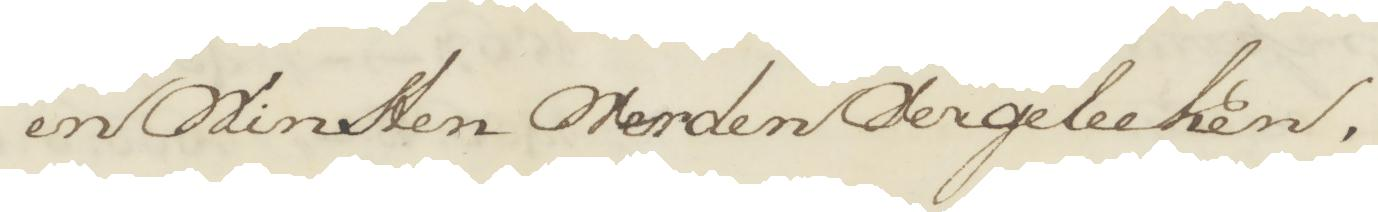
en winsten werden vergeleeken,
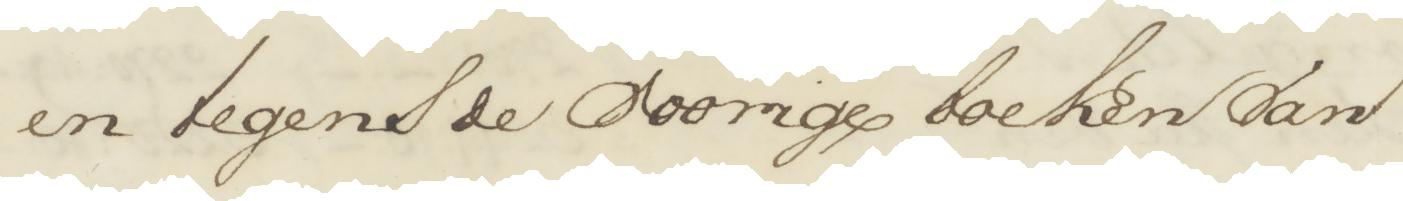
en tegens de voorige boeken van
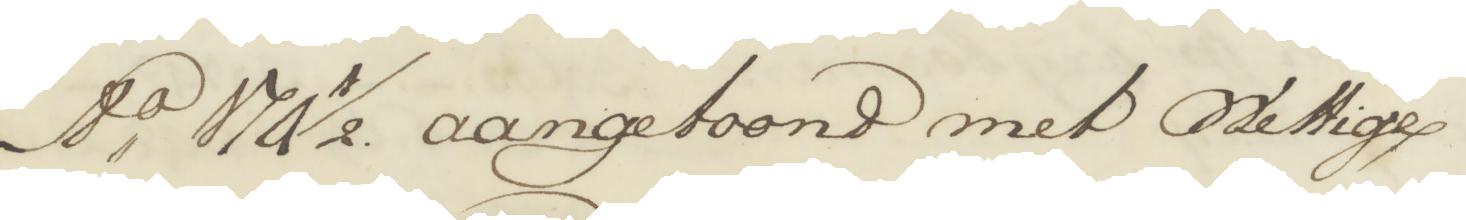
A„o 174½. aangetoond met wettige
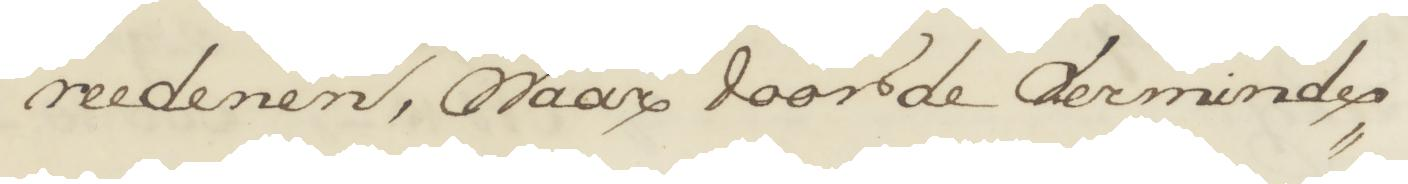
reedenen, waar door de verminde„
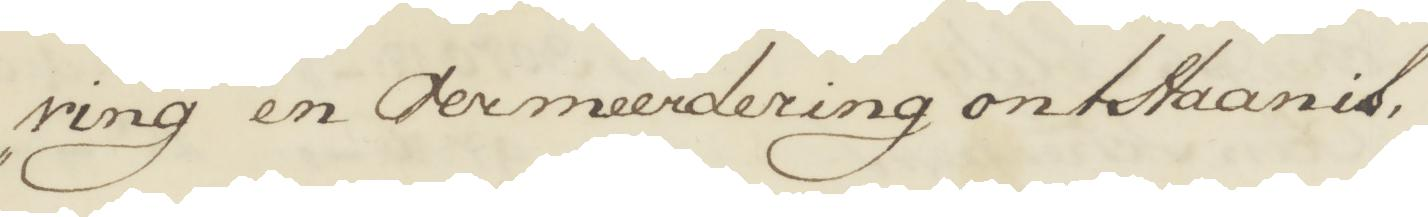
ring en vermeerdering ontstaan is,
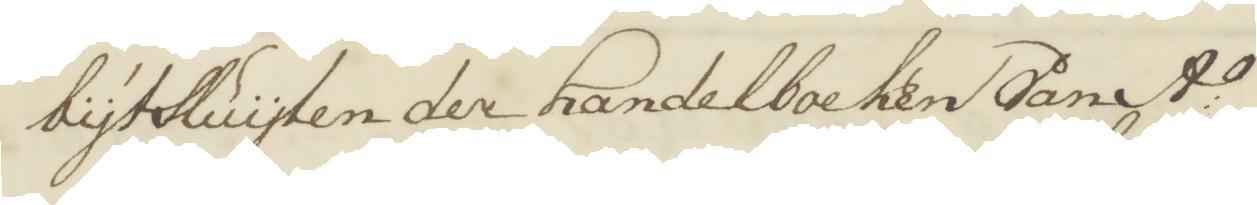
bij't sluijten der handelboeken van A:o
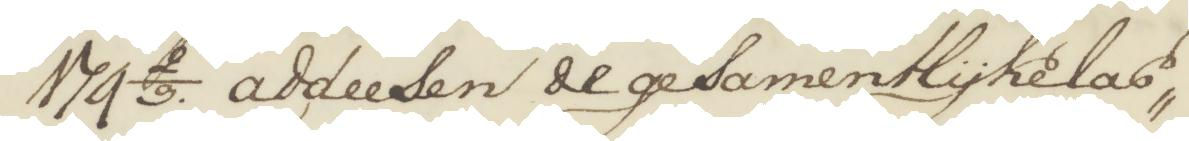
174 2/3. addeesen de gesamentlijke las„
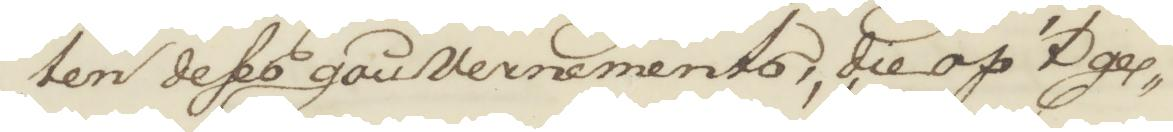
ten deses gouvernements, die op ’t ge„
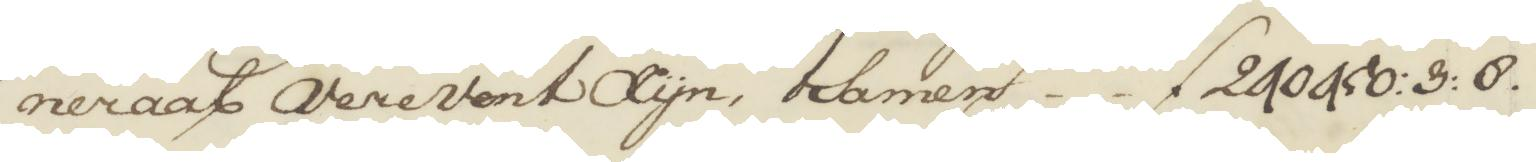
neraal verevent zijn, 'tsamen - - ƒ240450: 3: 8.
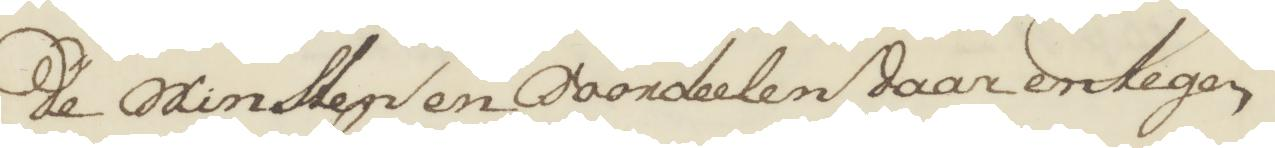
de winsten en voordeelen daar en tegen
